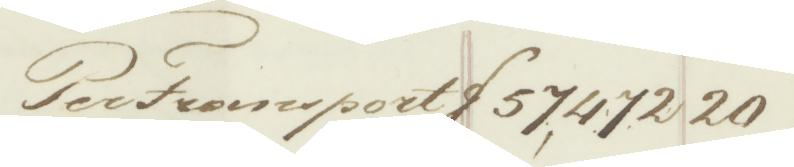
Per Transport ƒ 57,472 20
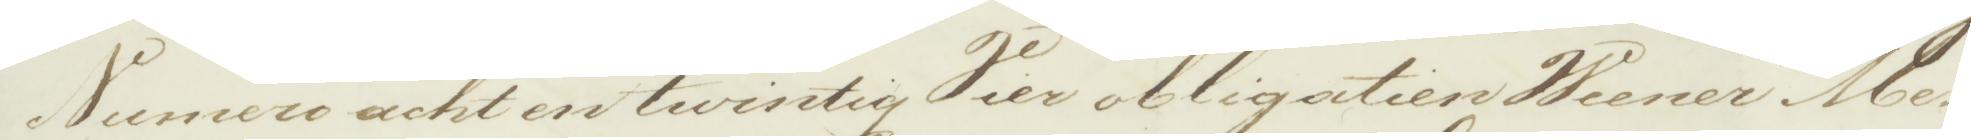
Numero acht en twintig Vier obligatien Weener Me„
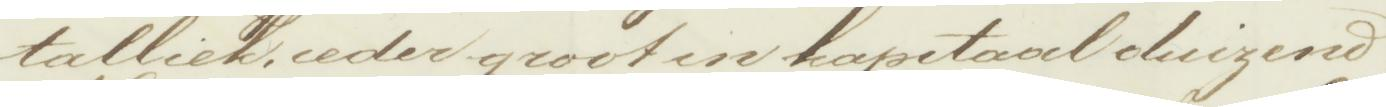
talliek, ieder groot in kapitaal duizend
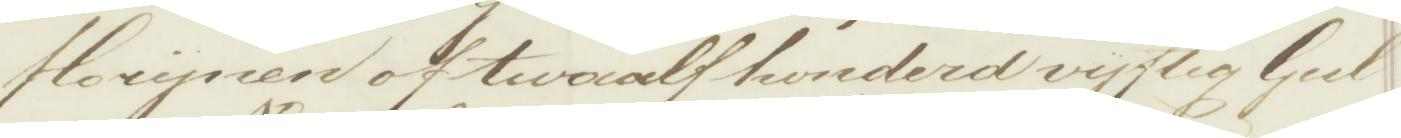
florijnen of twaalf honderd vijftig Gul
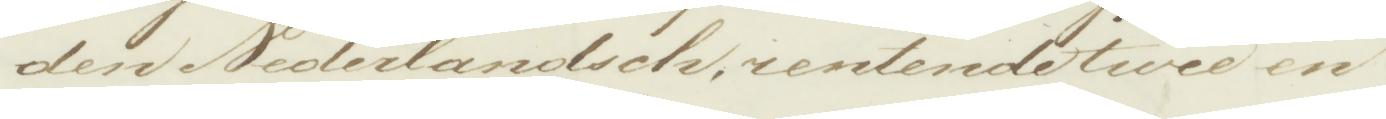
den Nederlandsch, rentende twee en
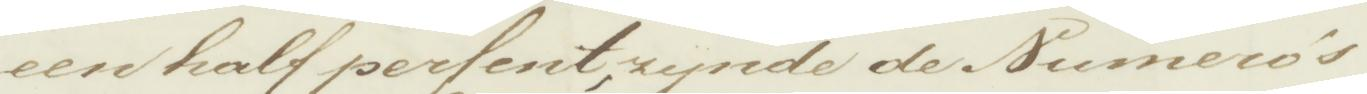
een half percent, zijnde de Numero's
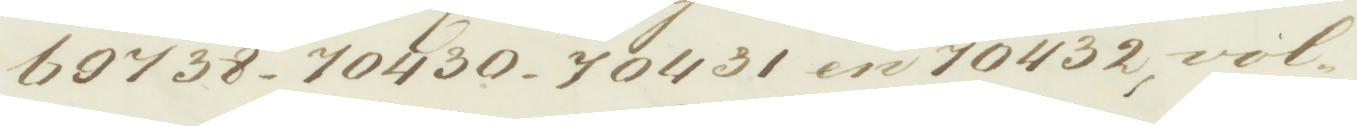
60738.70430. 70431 en 70432, vol„
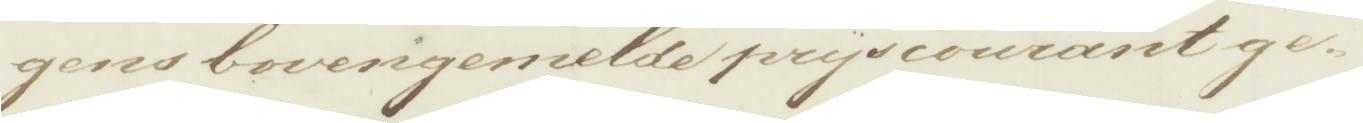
gens bovengemelde prijscourant ge„
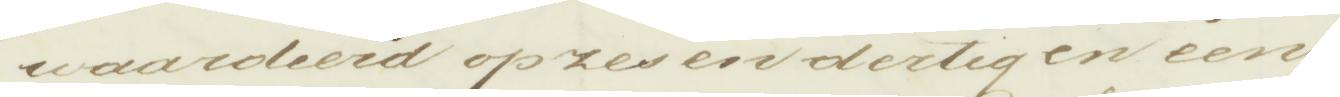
waardeerd op zes en dertig en een
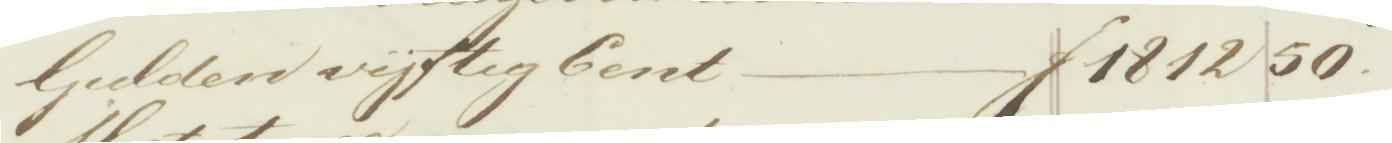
Gulden vijftig Cent — ƒ1812 50.
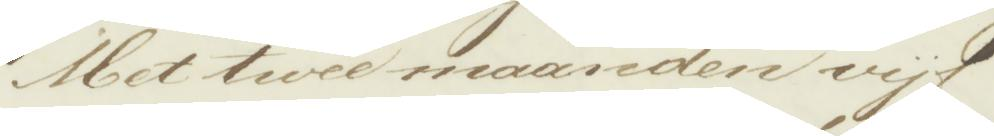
Met twee maanden vijf
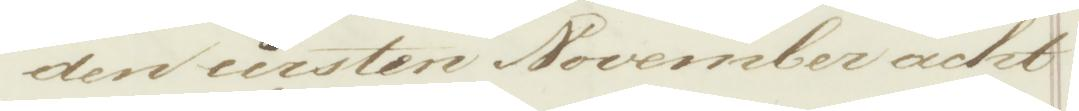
den eersten November acht
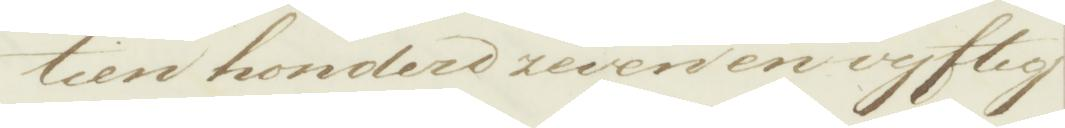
tien honderd zeven en vyftig
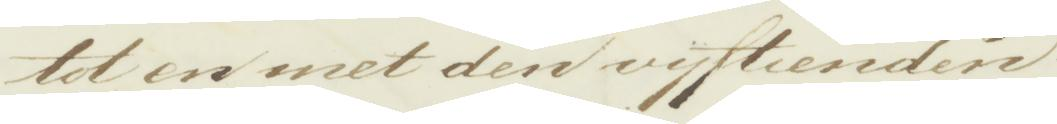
tot en met den vijftienden
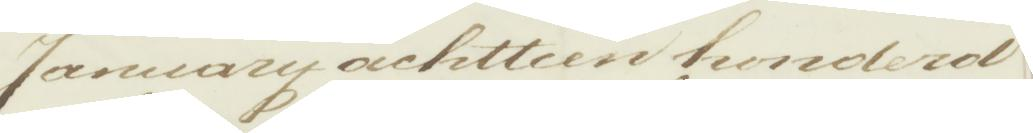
January achttien honderd
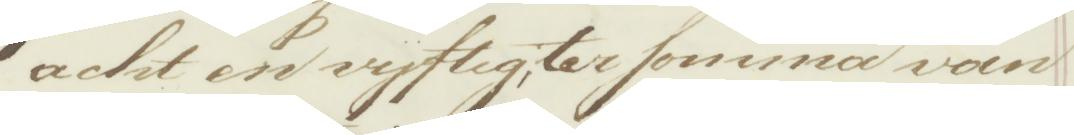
acht en vijftig ter somma van
